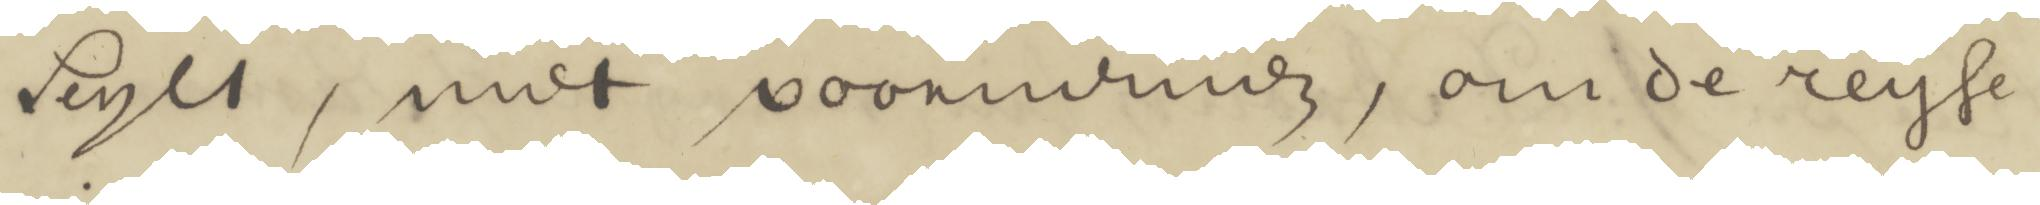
seylt, met voornemen, om de reijse
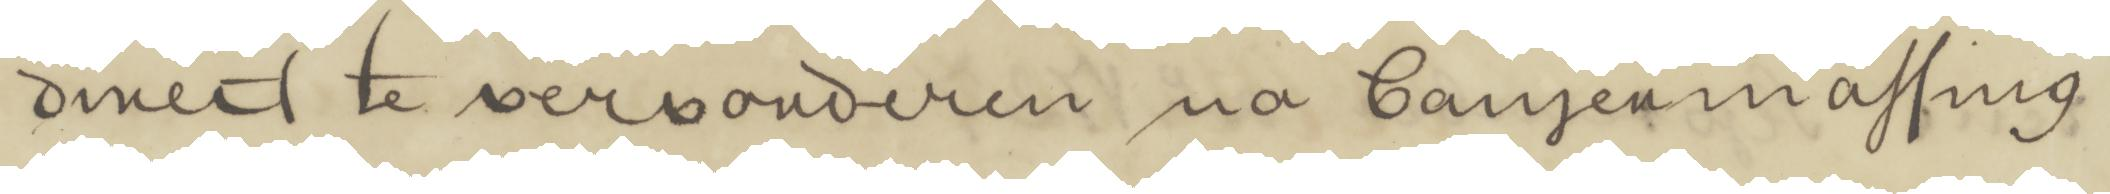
direct te vervorderen na banjermassing
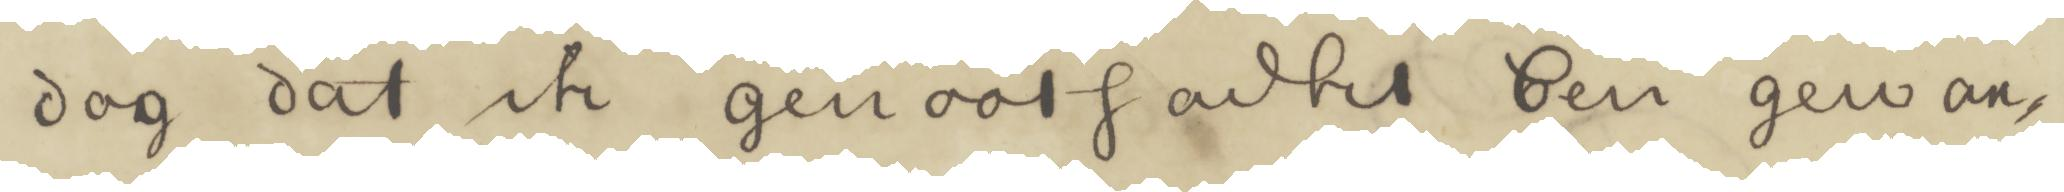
dog dat ik genootsaekt ben gewor„
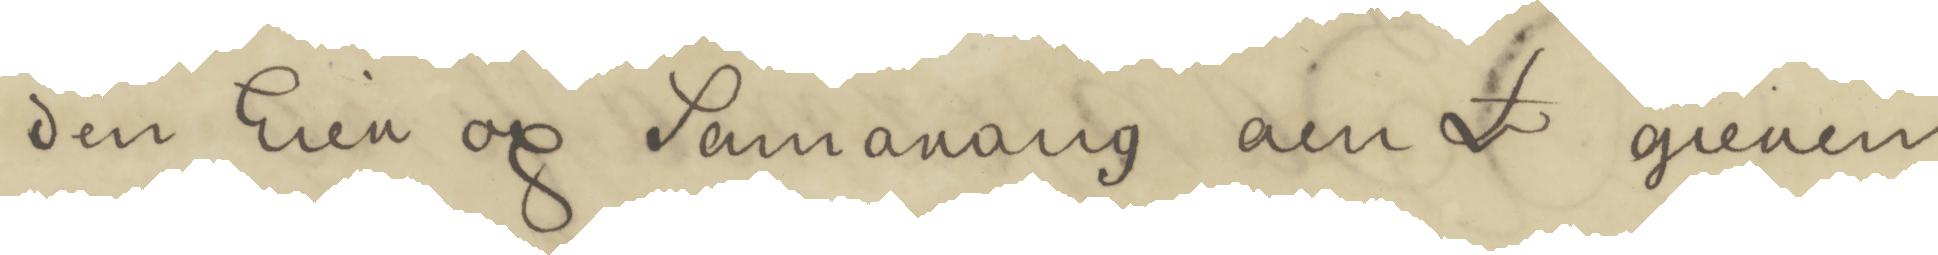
den hier op Samarang aen te gieren
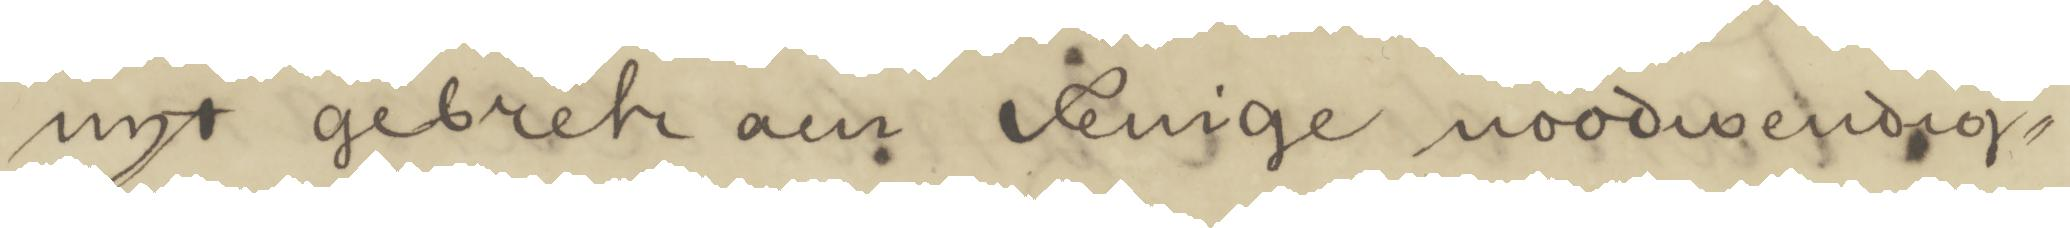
uyt gebrek aen Eenige noodwendig„
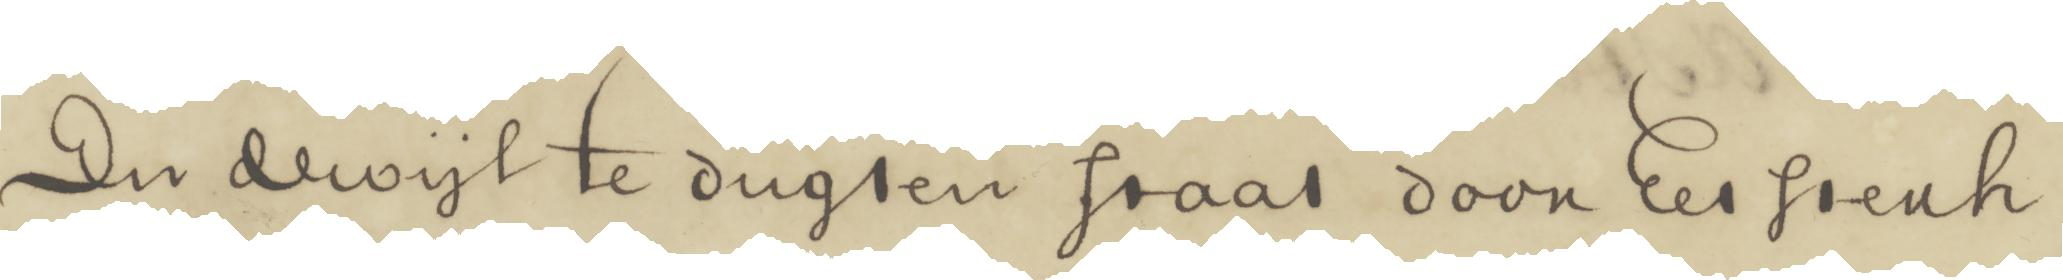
En dewijl te dugten staat door het sterk
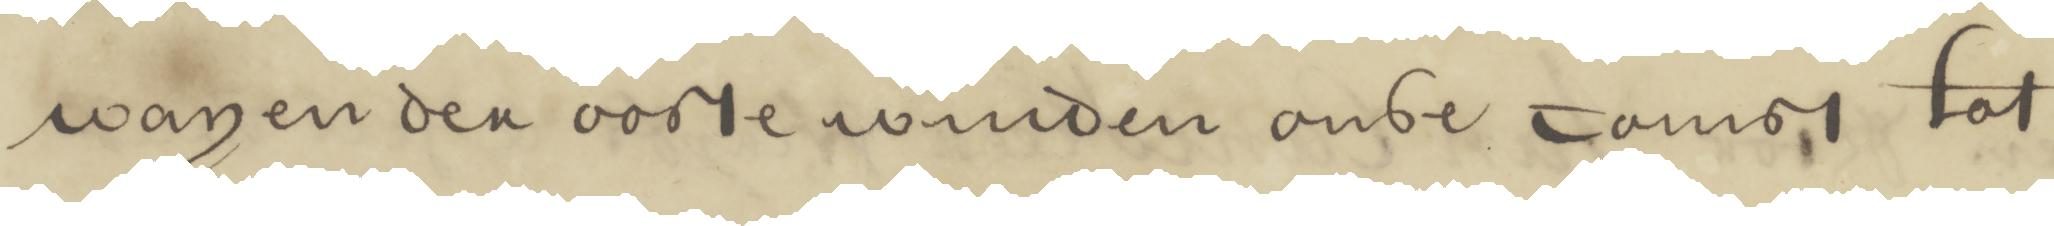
wayen der ooste winden onse comst tot
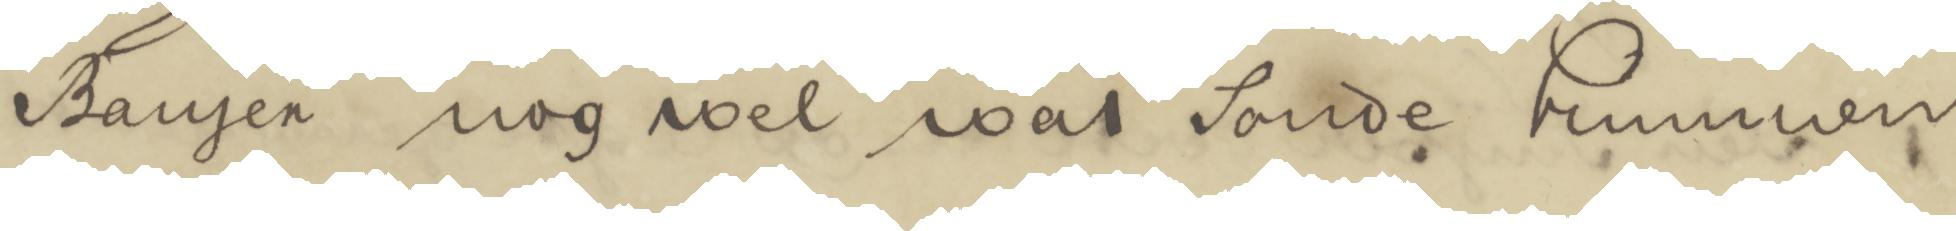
Banjer nog wel wat soude kunnen
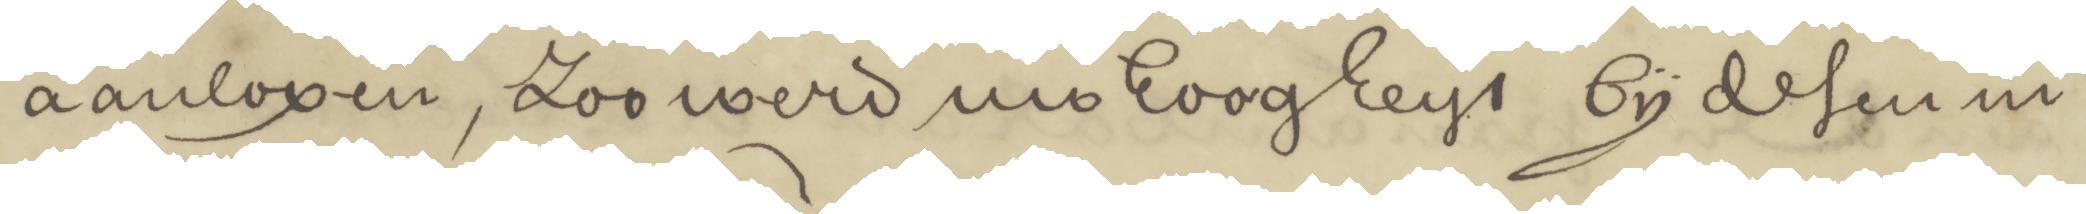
aanlopen, zoo werd uw hoogheyt bij desen in
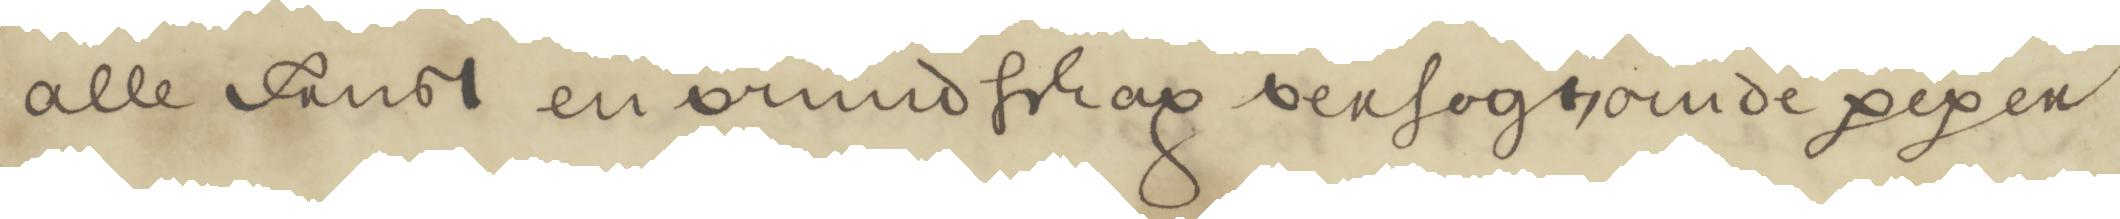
alle Ernst en vrundschap versogt, om de peper
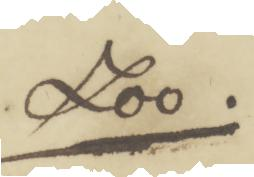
zoo.
